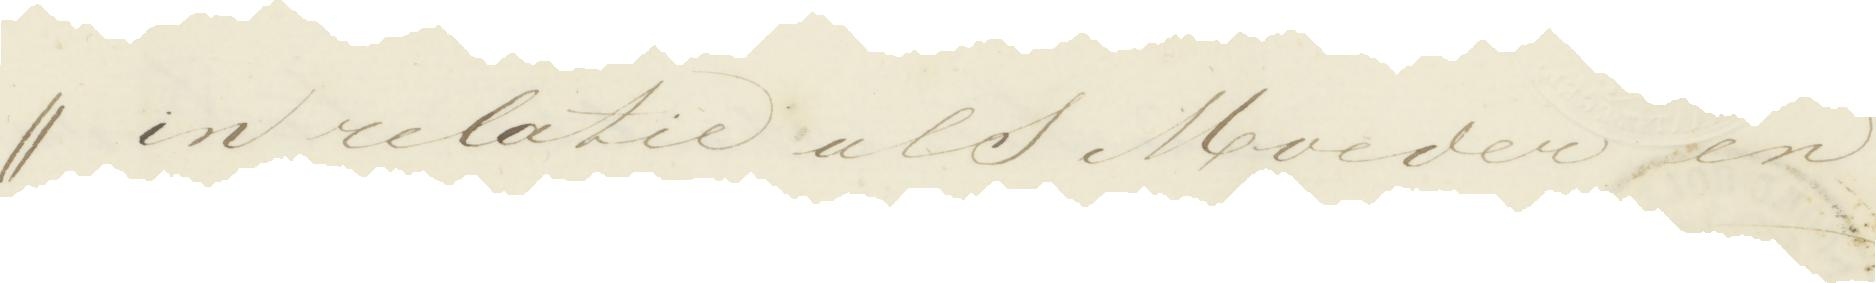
„ in relatie als Moeder en
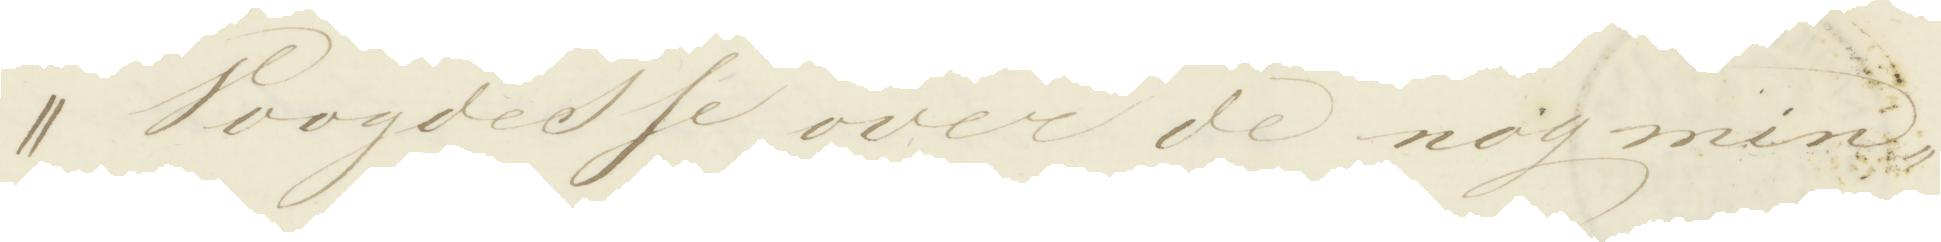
„ Voogdesse over de nog min„
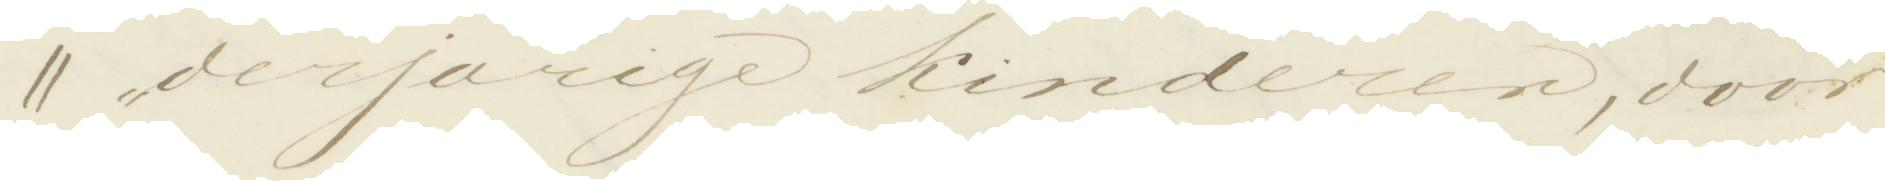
„ „derjarige kinderen, door
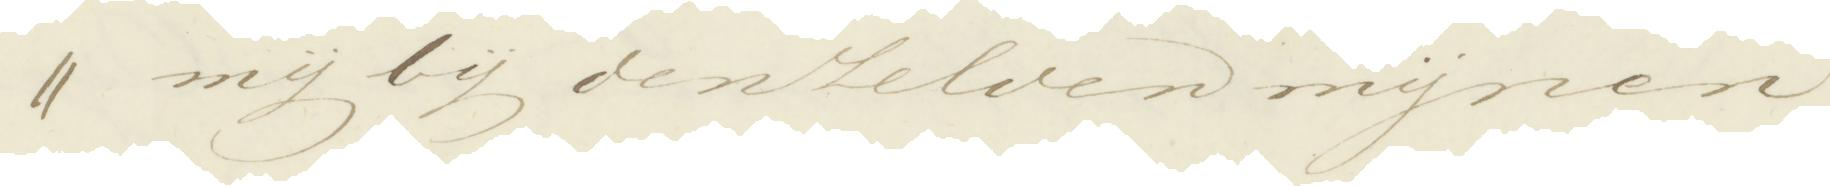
mij bij denzelven mijnen
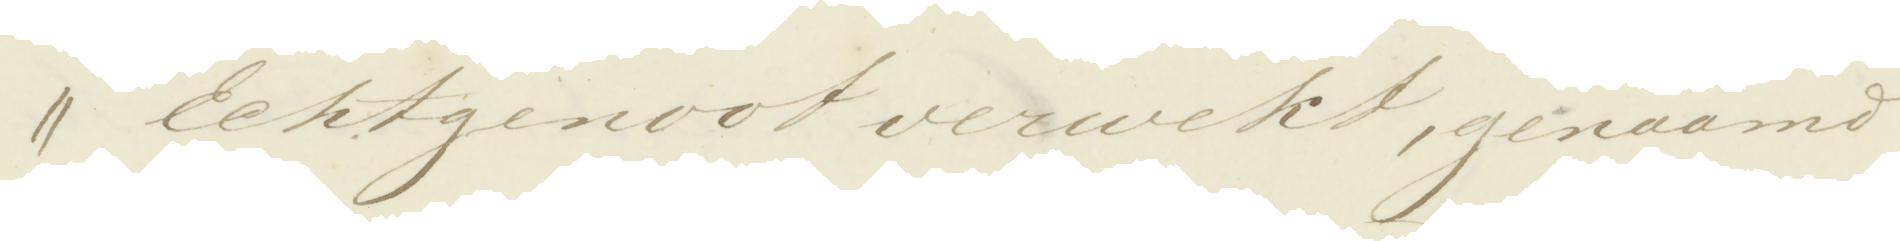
„ Echtgenoot verwekt, genaamd
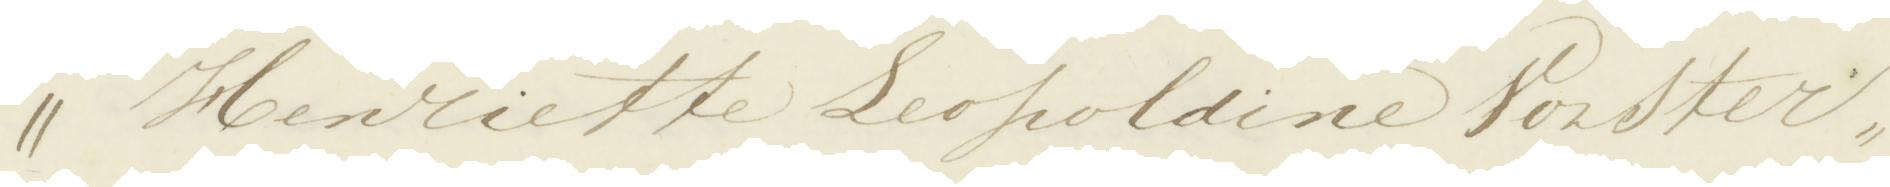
„ Henriette Leopoldine Vorster„
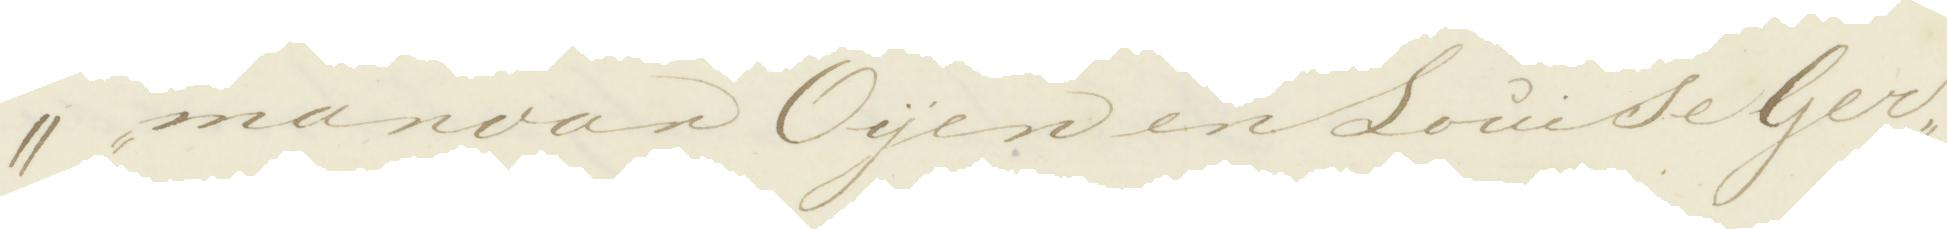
„man van Oijen en Louise Ger
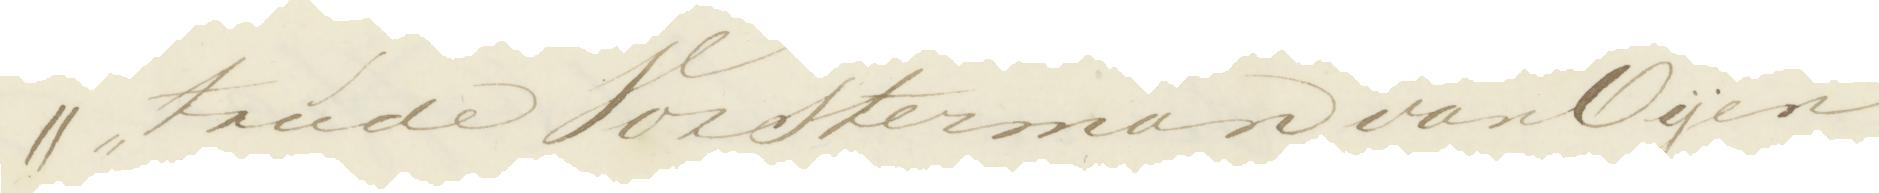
„„trude Vorsterman van Oijen
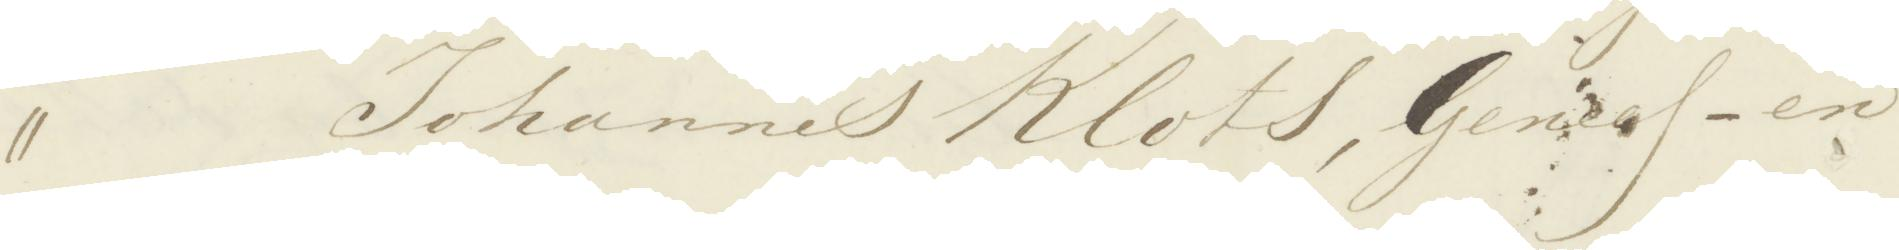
„ Iohannes Klots, Genees-en
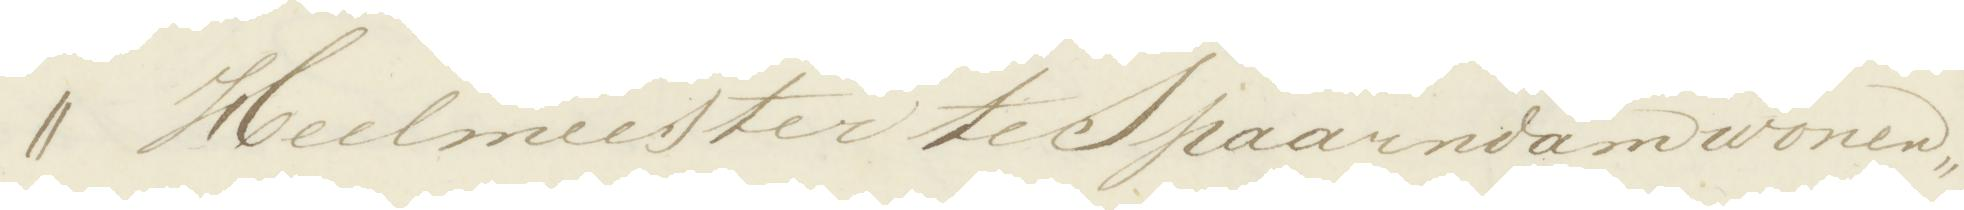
„ Heelmeester te Spaarndam wonen,
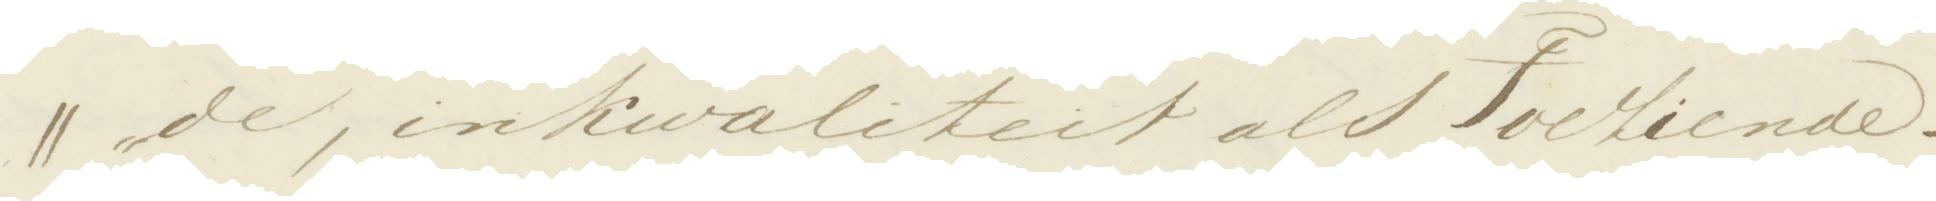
„ „de, in kwaliteit als Toeziende -
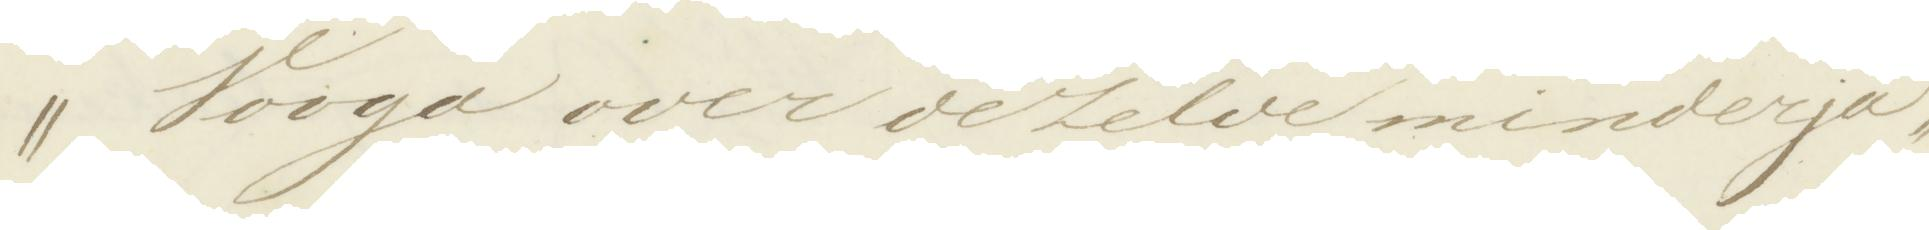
Voogd over dezelve minderja
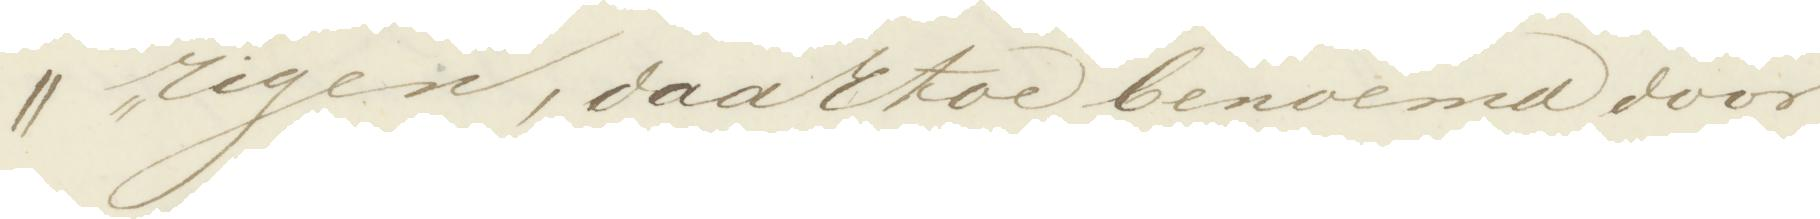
„ „rigen, daartoe benoemd door
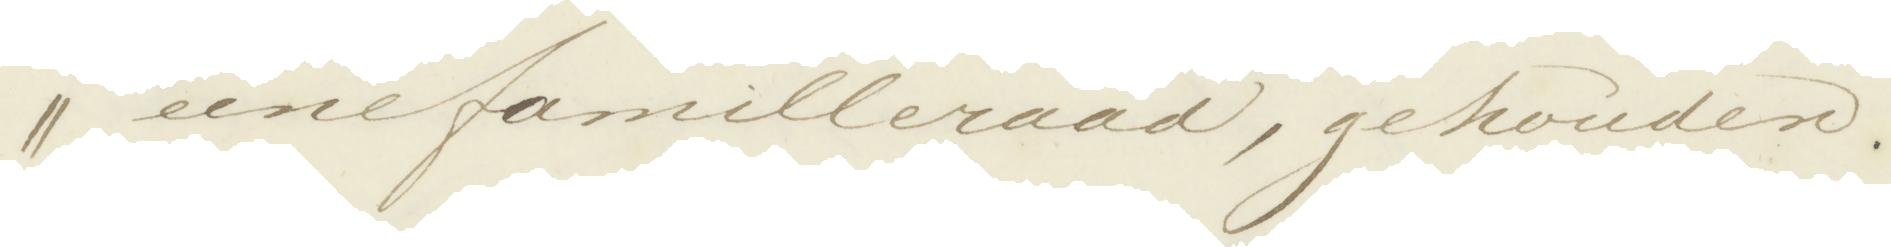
„ eene familleraad, gehouden.
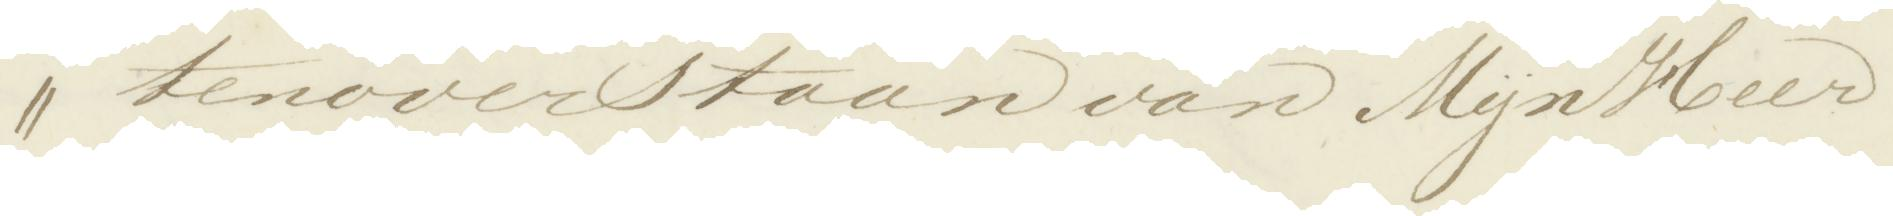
„ tenoverstaan van Mijn Heer
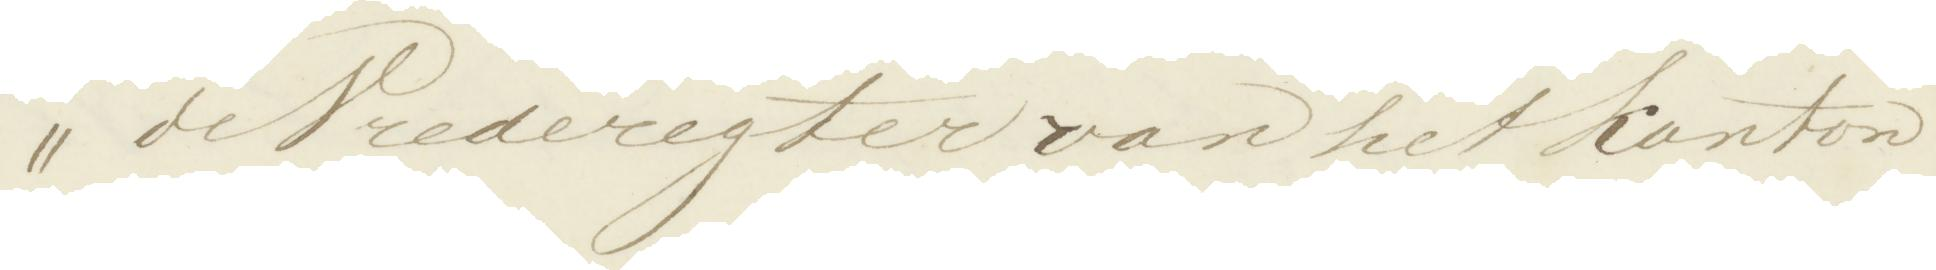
„ de Vrederegter van het kanton
